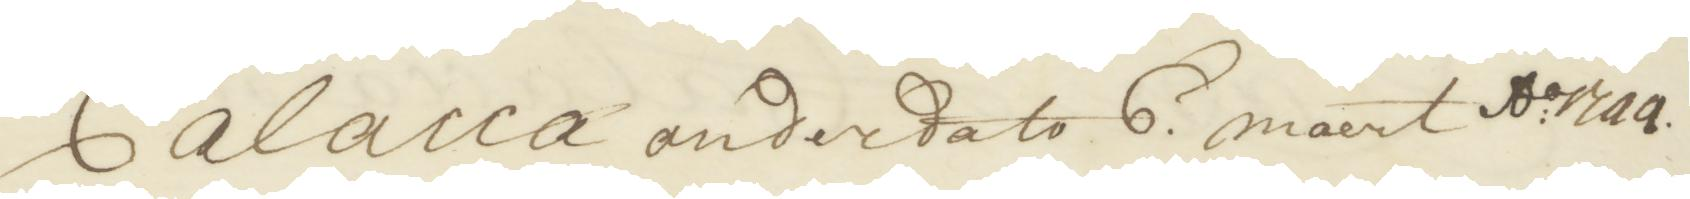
Malacca onder dato 6.' maert A:o 1744.
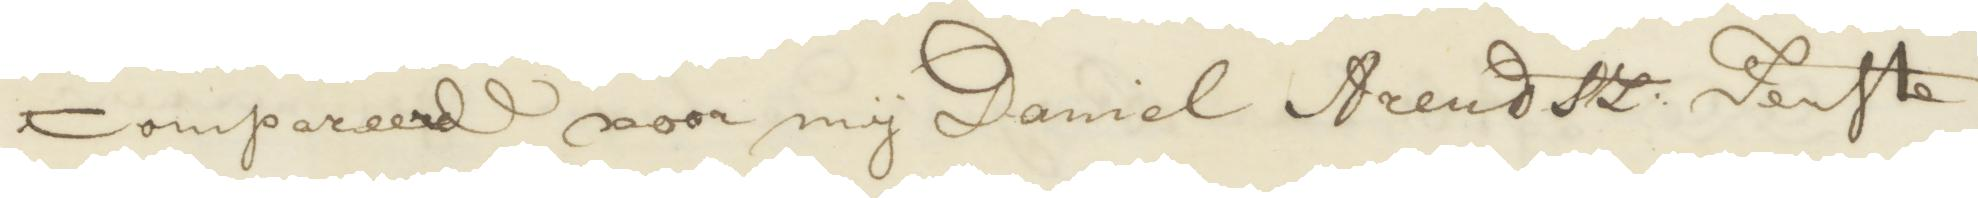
Compareerde voor mij Daniel Arendsz: Eerste
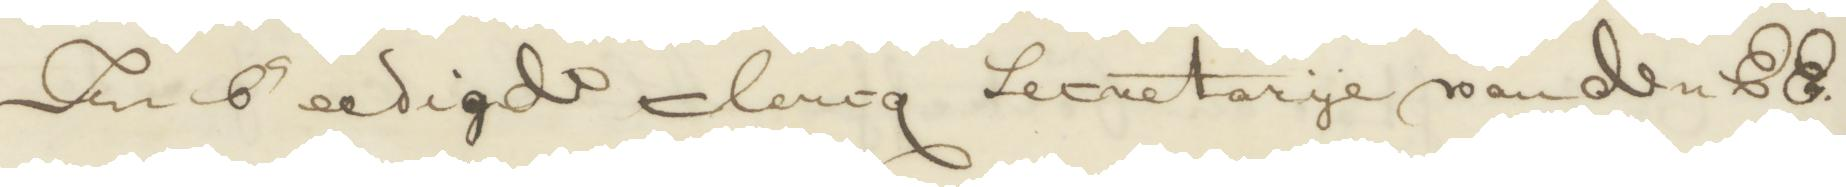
En b'eedigde clercq secretarije van den E E.
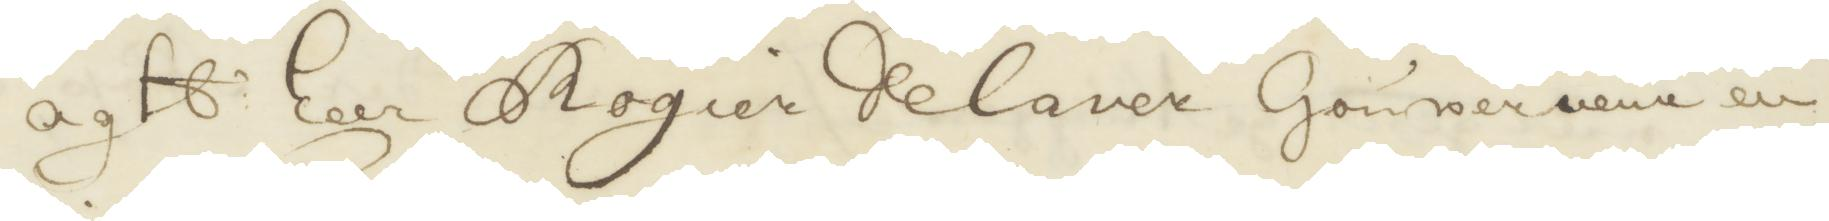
agtb:' heer Rogier de laver Gouverneur en
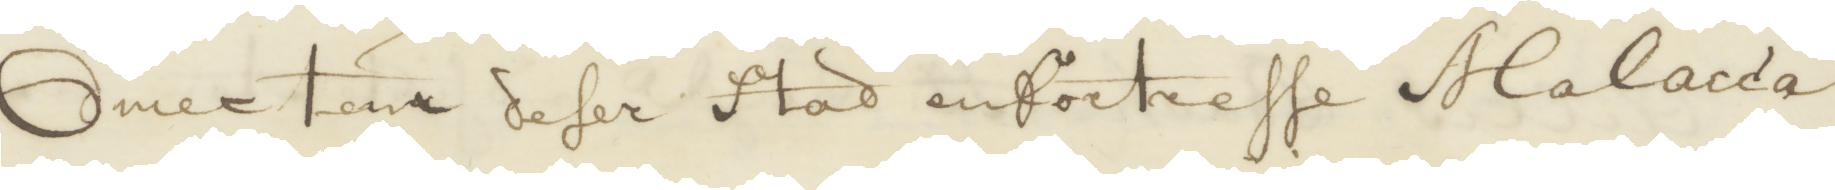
directeur deser stad en fortresse Malacca
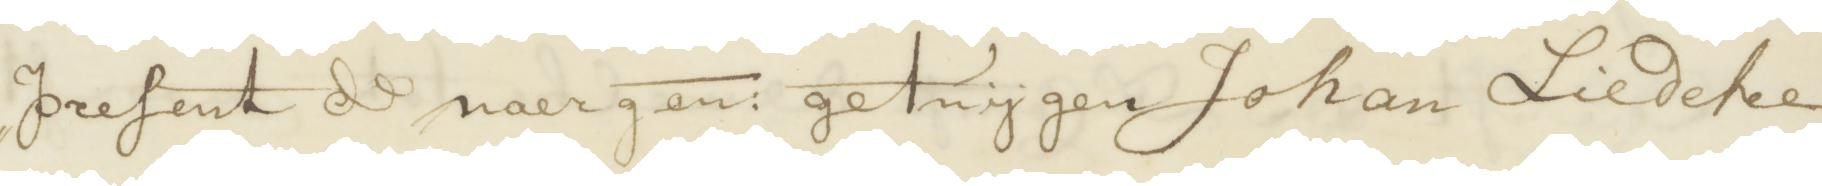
present de naer gen: getuijgen Johan Liedeke
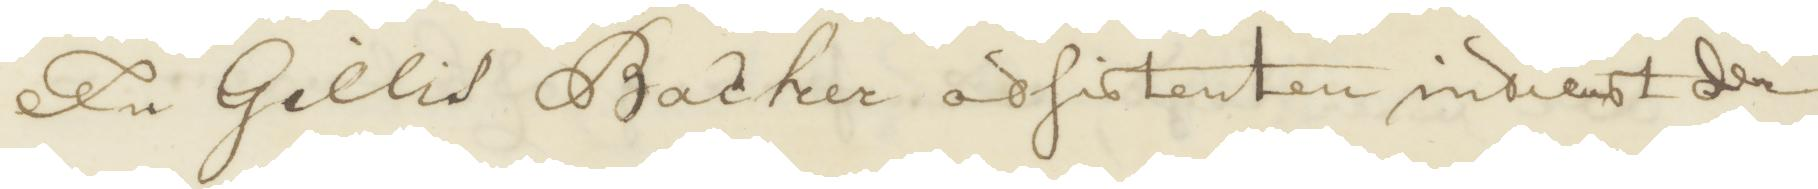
En Gillis Backer adsistenten in dienst der
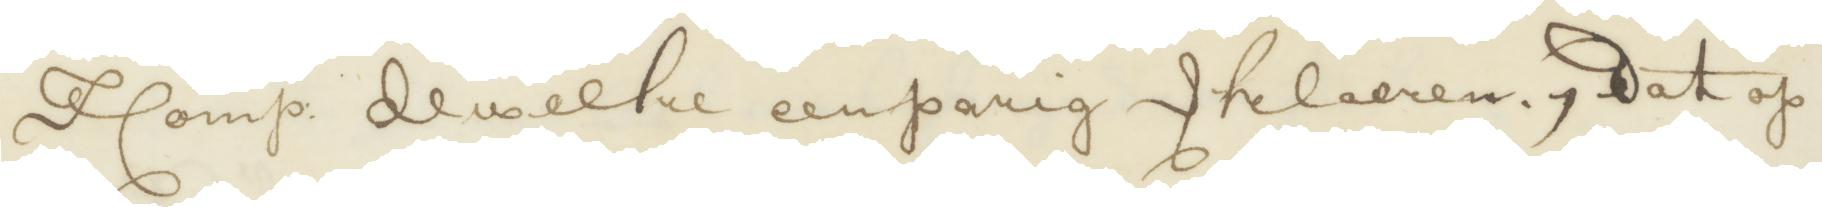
E Comp: de welke eenparig verklaeren., dat op
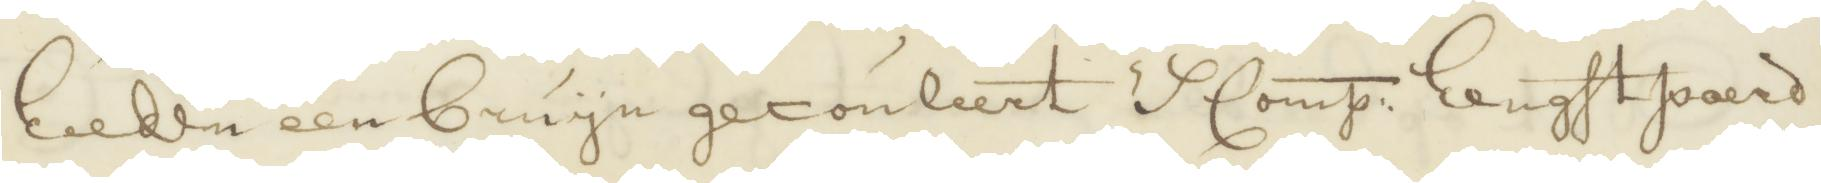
heeden een bruijn gecouleert 's Comp: hengstpaerd
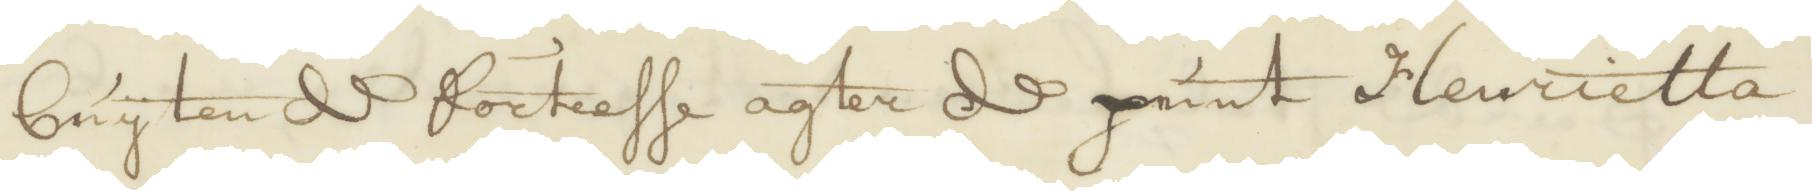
buijten de forteesse agter de punt Henrietta
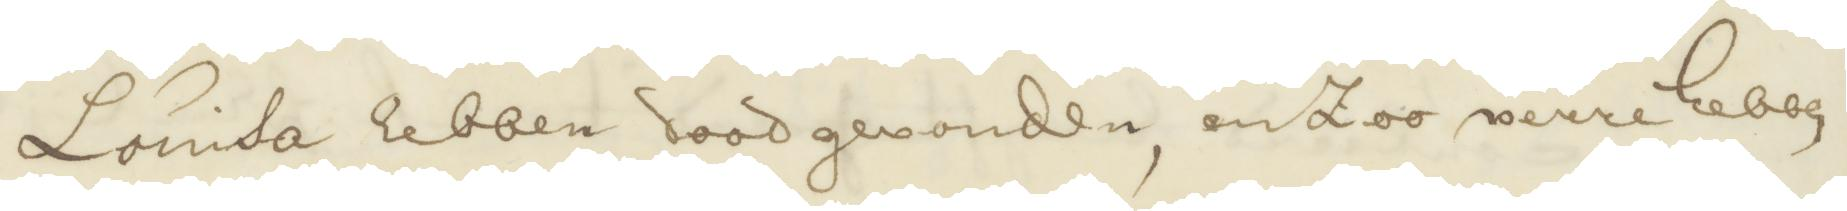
Louisa hebben dood gevonden, en Zoo verre hebben
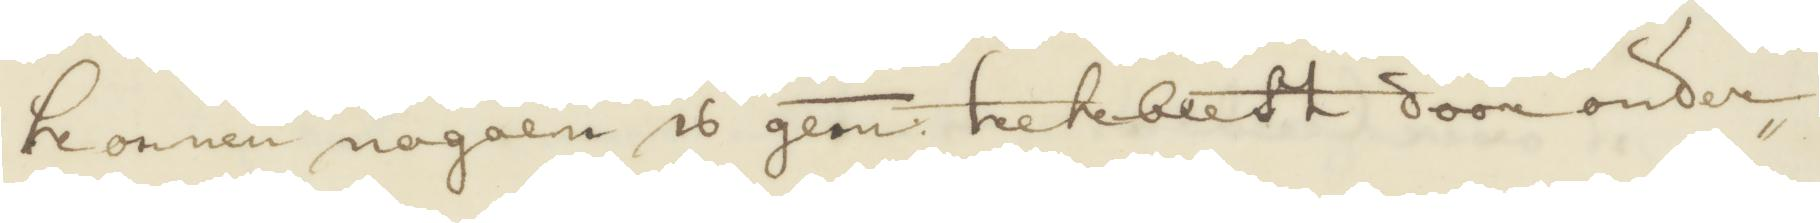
konnen nagaen is gem: trekbeest door ouder„
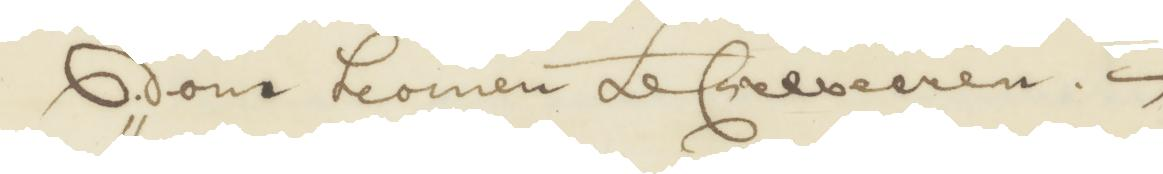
„dom komen te creveeren.
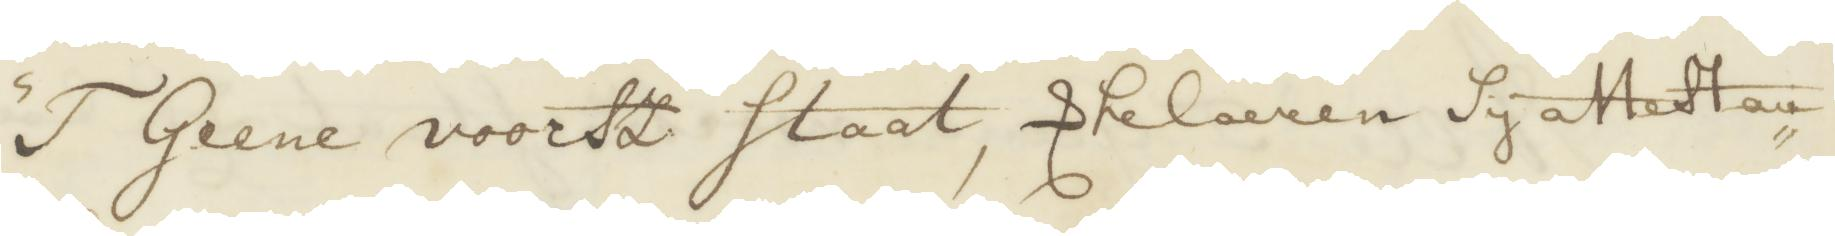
'T Geene voorsz: staat, verklaeren sij attestan„
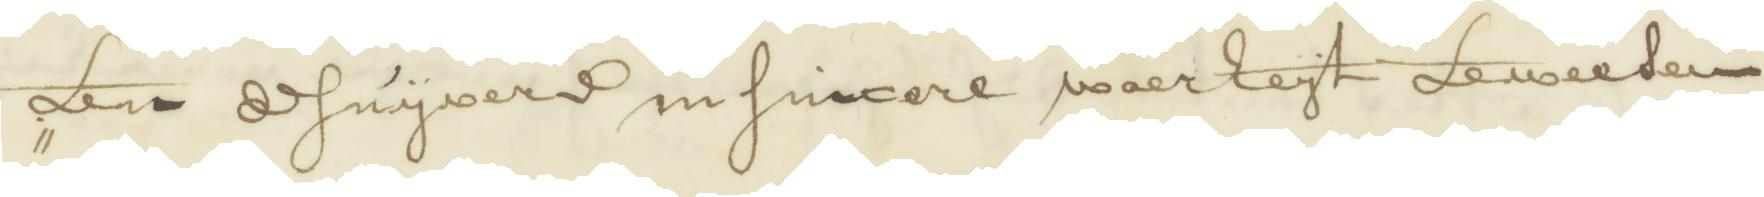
„ten desuijvere in sincere waerheijt te weesen
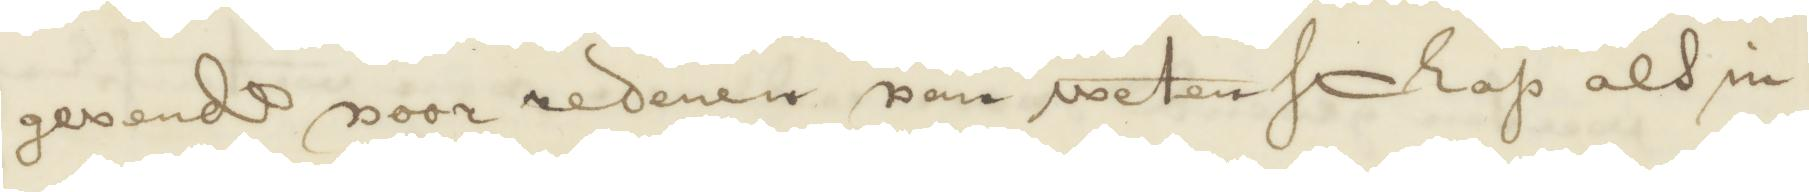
gevende voor redenen van wetenschap als in
